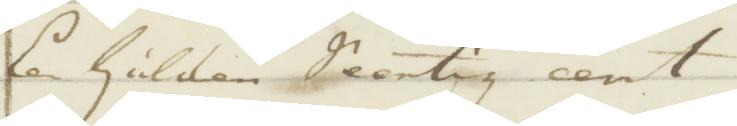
Een Gulden Veertig cent
